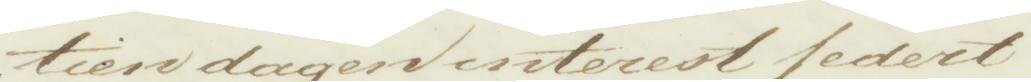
tien dagen interest sedert
